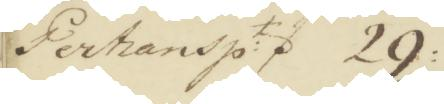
Pertransp:t ƒ 29:
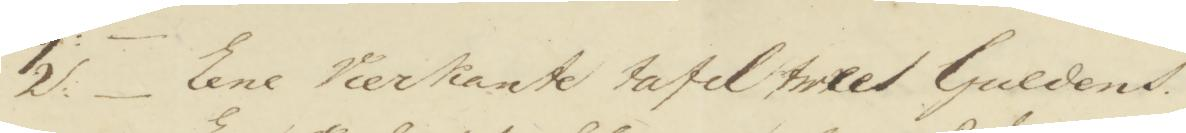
2: — Eene Vierkante tafel twee Guldens.
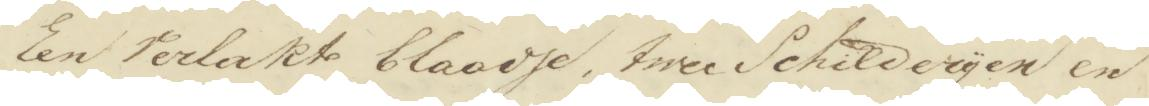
Een Verlakt blaadje, twee schilderijen en
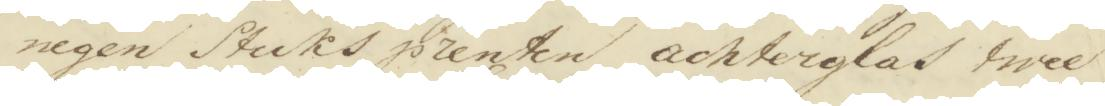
negen stuks prenten achterglas twee
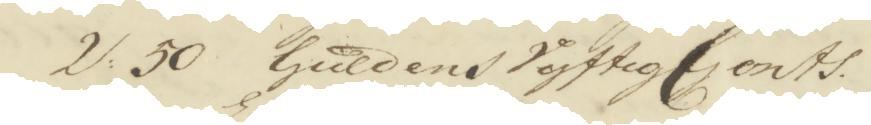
2: 50 Guldens Vyftig Cents.
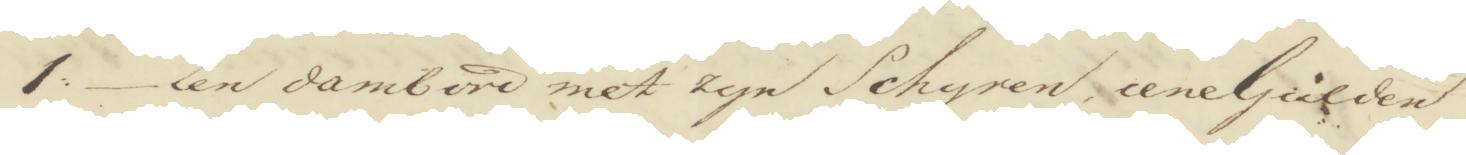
1: — Een dambord met zyn schyven, eene Gulden
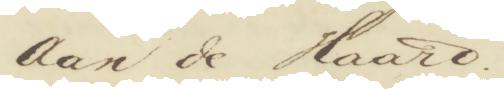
aan de Haard.
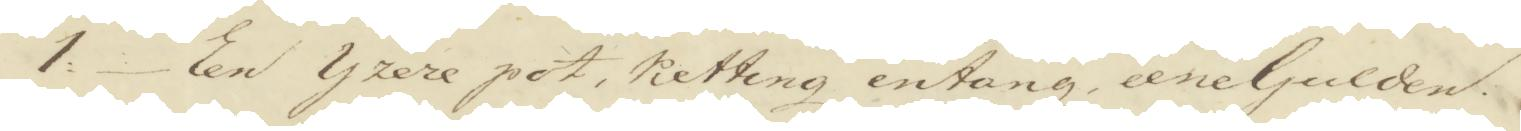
1:— Een Yzere pot, ketting entang, eene Gulden.
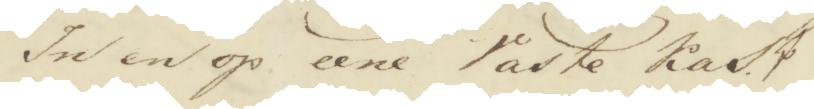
In en op eene Vaste kas.t
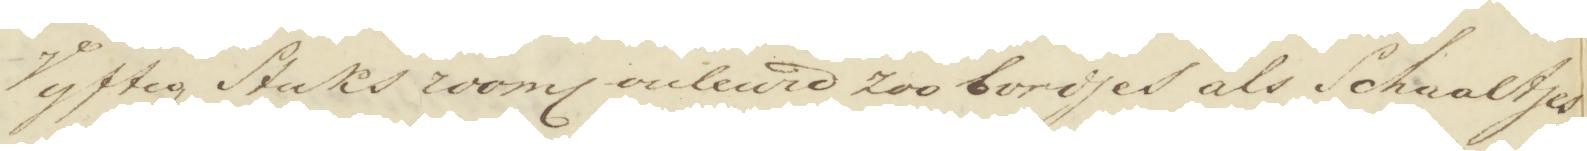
Vyftig stuks roomcouleurd zoo bordjes als schaaltjes
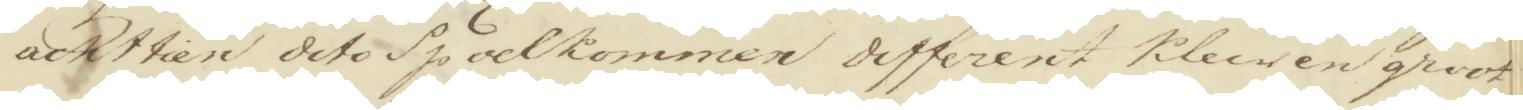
achttien dito spoelkommen different kleen en groot
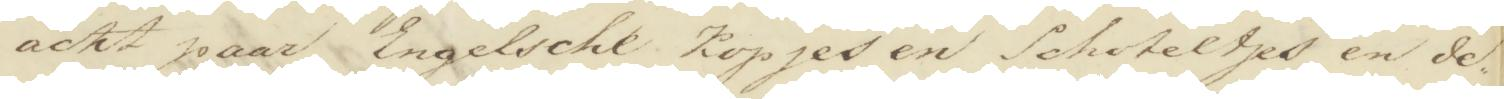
acht paar Engelsche kopjes en schoteltjes en de„
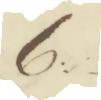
6: -
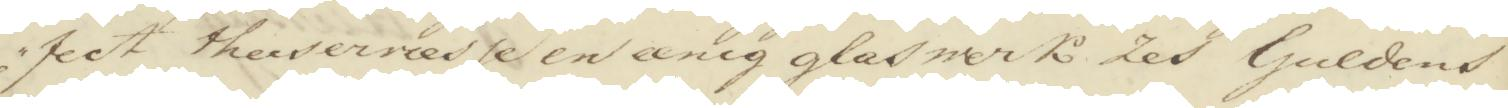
„fect theeserviesje en eenig glaswerk zes Guldens
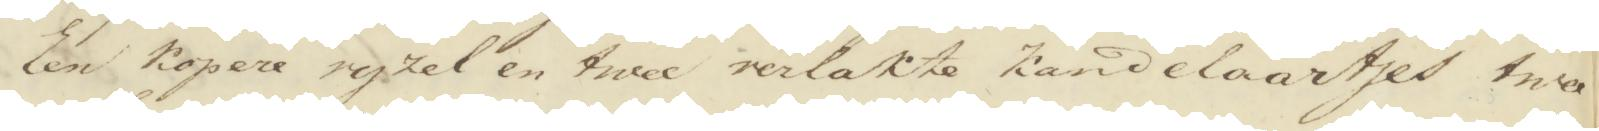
Een kopere vijzel en twee verlakte kandelaartjes twee
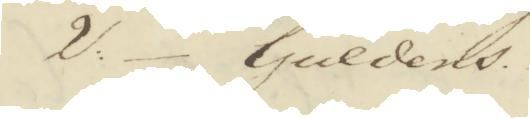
2: — Guldens.
